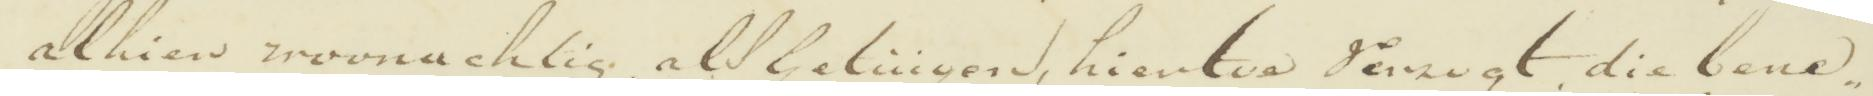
alhier woonachtig, als Getuigen, hiertoe verzogt, die bene„
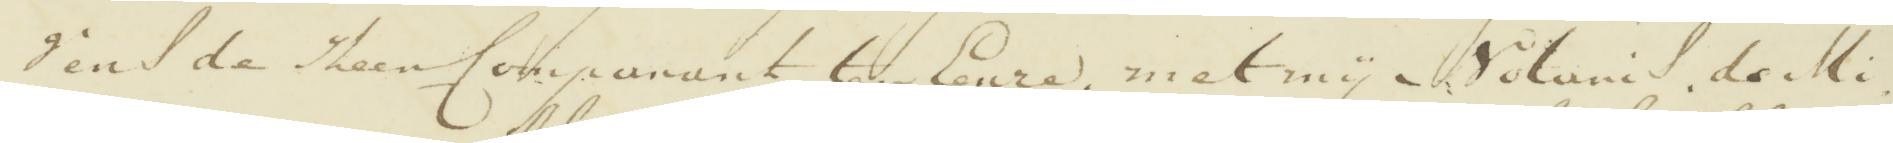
vens de Heer Comparant ten Eenre, met mij Notaris, de Mi„
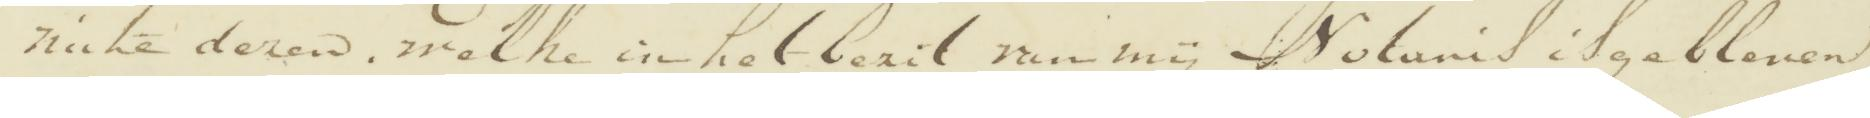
nute dezen, welke in het bezit van mij Notaris is gebleven
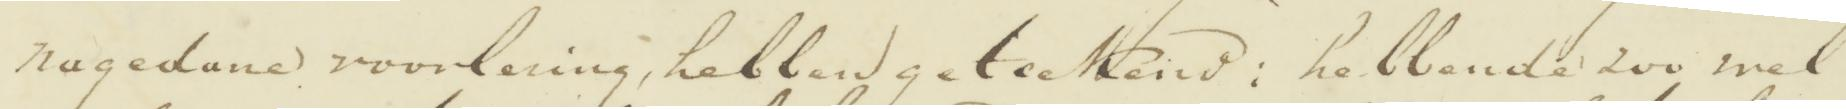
na gedane voorlezing, hebben geteekend: hebbende zoo wel
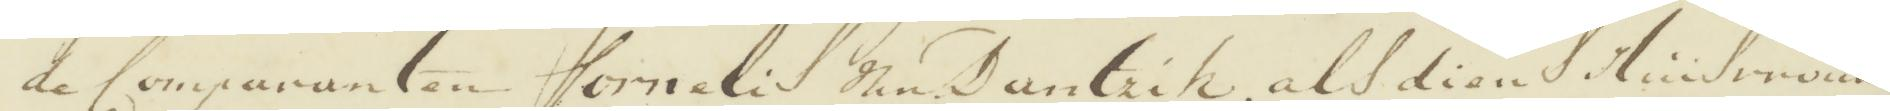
de Comparanten Cornelis van Dantzik, als diens Huisvrouw
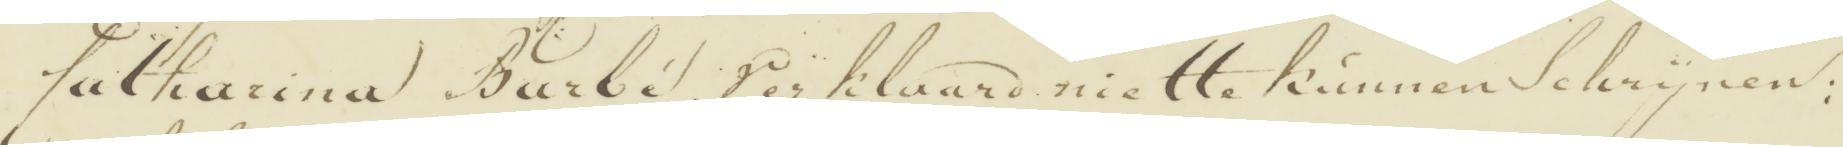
Calharina Barbé, verklaard niet te kunnen schrijven:
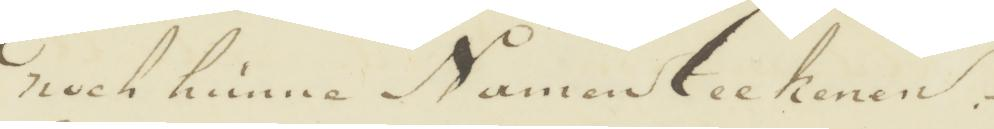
noch hunne Namen teekenen.
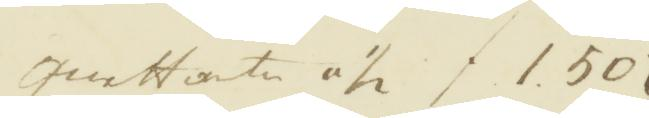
quittantie 11½ ƒ. 1.50
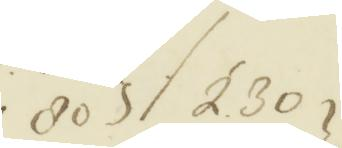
803 } ƒ2.30
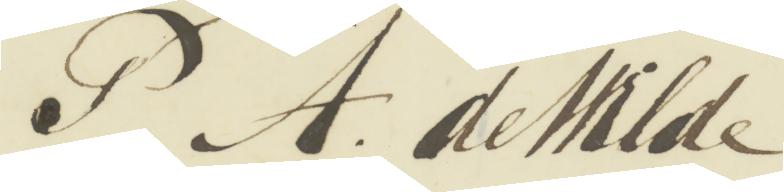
P A: de Wilde
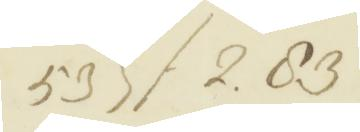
53 } ƒ 2.83
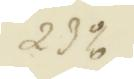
23½
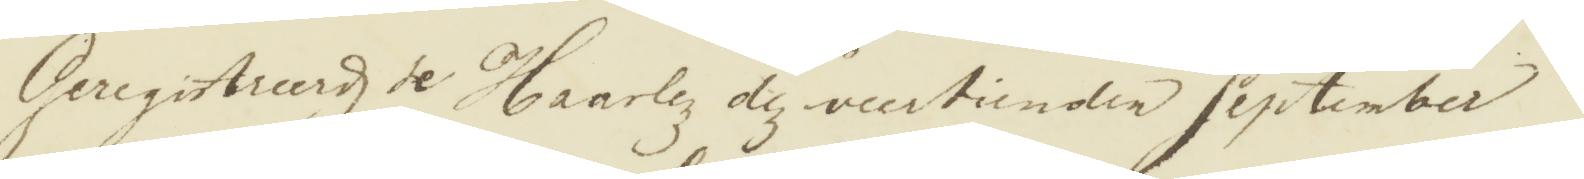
Geregistreerd te Haarlem den veertienden September
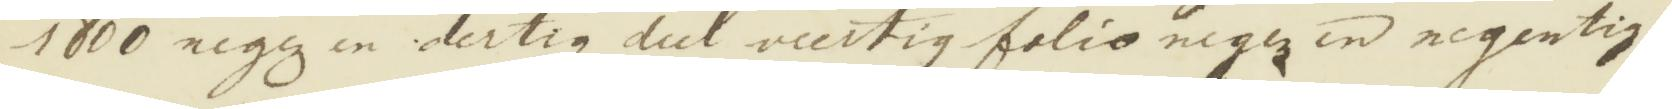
1800 negen en dertig deel veertig folio negen en negentig
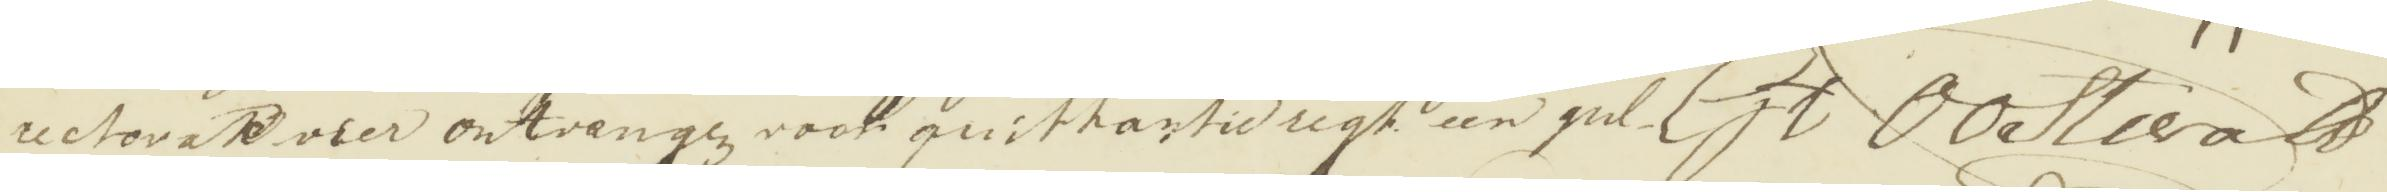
recto vak vier ontvangen voor quittantie regt een gul- Gt Oostwald
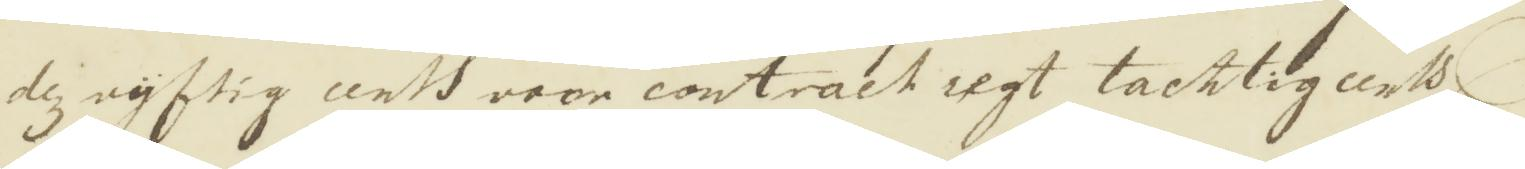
den vijftig cents voor contract regt tachtig cents
